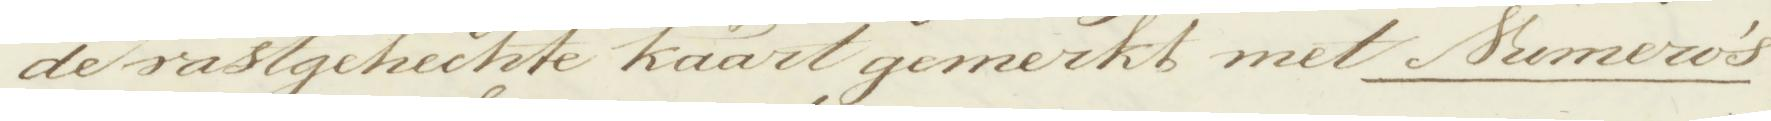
de vastgehechte kaart gemerkt met Numero's
